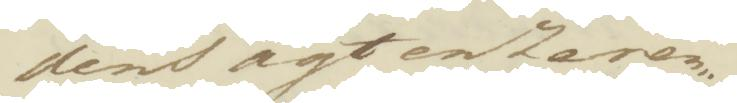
dens agt en Zeven„
